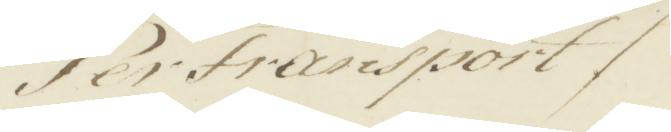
Per Transport ƒ 91„ 50
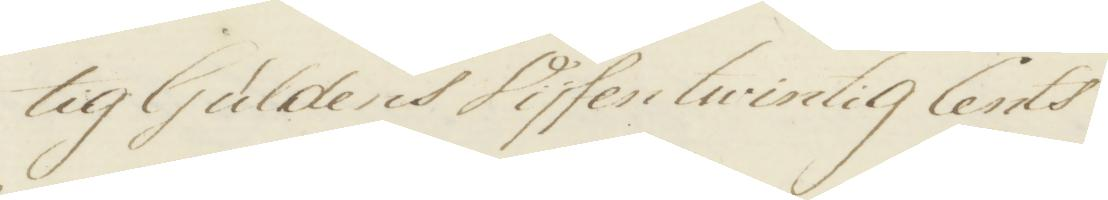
tig Guldens Vijf en twintig Cents . . . . . . . „ . 23„ 25
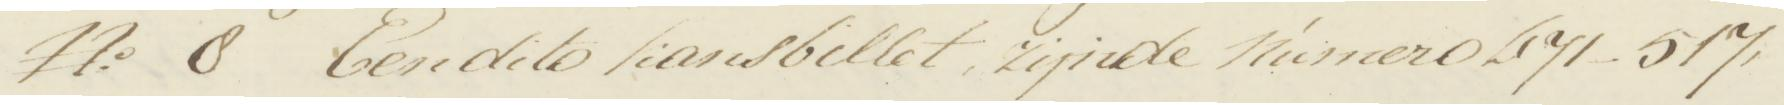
N:o 8 Een dito kansbillet, zijnde numero 471 . 517,
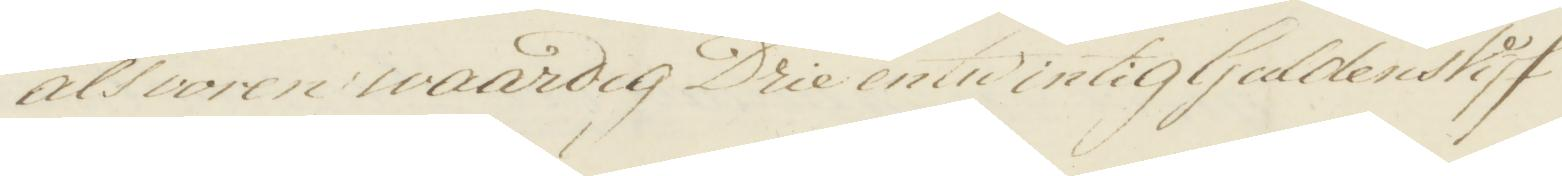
als voren waardig Drie en twintig Guldens Vijf
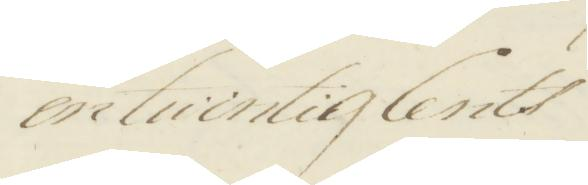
en twintig Cents . . . . . . . . . . „ 23„ 25
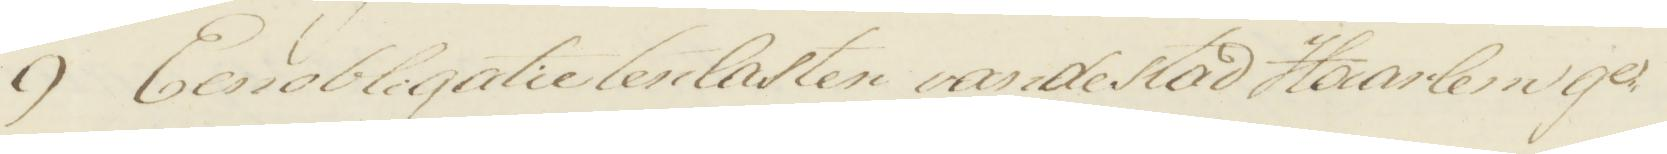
9 Een obligatie ten lasten van de stad Haarlem ge„
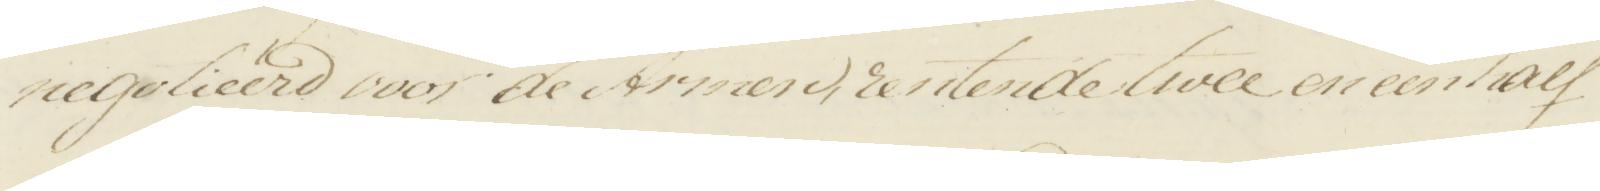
negotieerd voor de Armen, rentende twee en een half
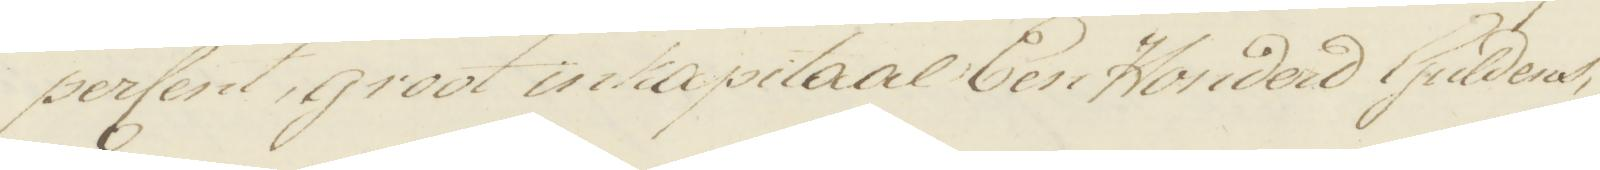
percent, groot in kapitaal Een Honderd Guldens,
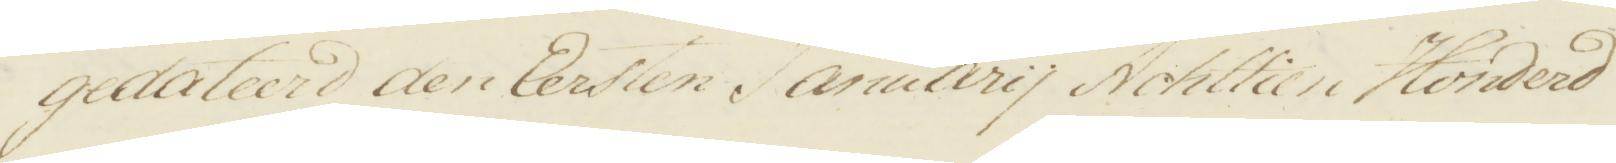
gedateerd den Eersten Ianuarij Achttien Honderd
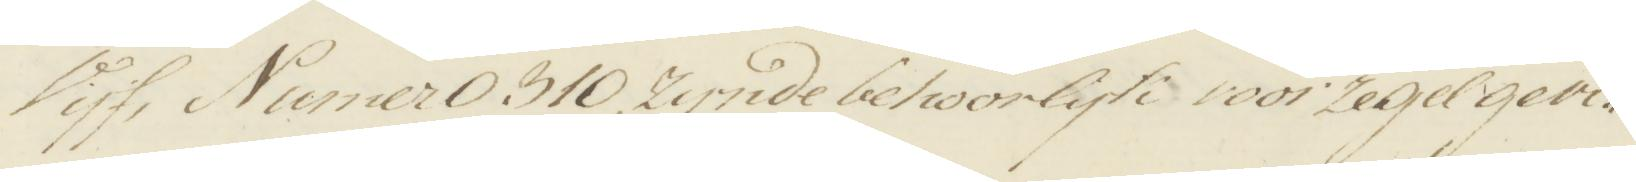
Vijf, Numero 310, zynde behoorlyk voor zegel gevi„
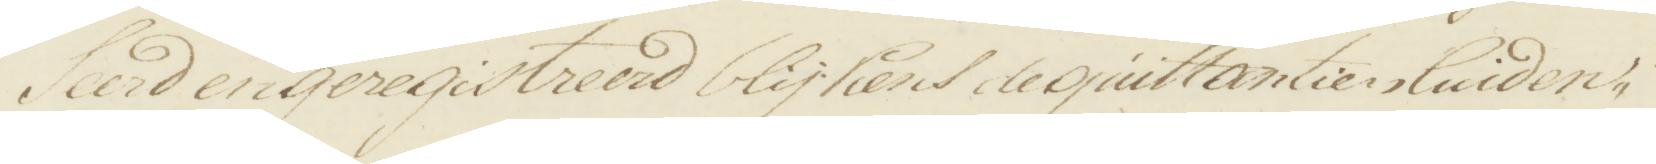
seerd en geregistreerd blijkens de quittantien luiden„
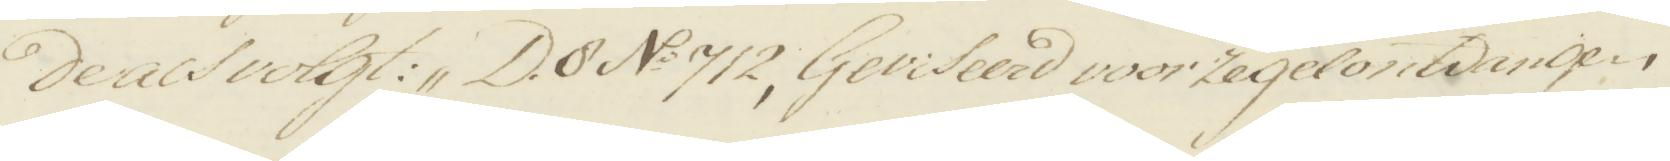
de alsvolgt: „ D. 8 N-o 712, Geviseerd voor zegel ontvangen
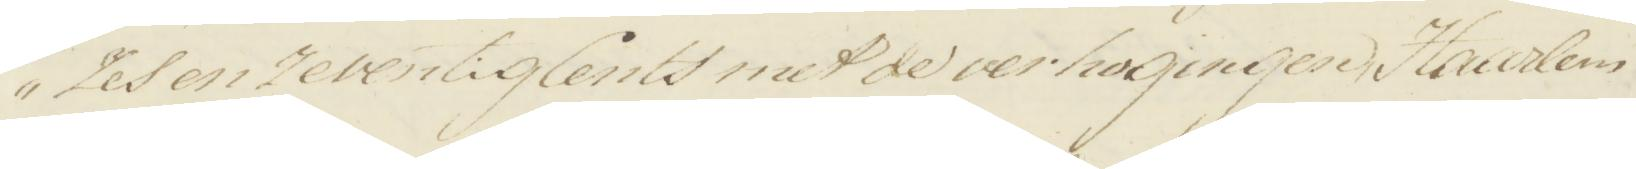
„ zes en zeventig Cents met de verhogingen, Haarlem
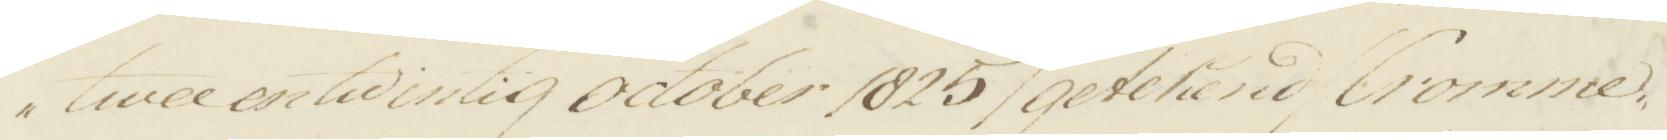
„ twee en twintig october 1825 /getekend/ Cromme„
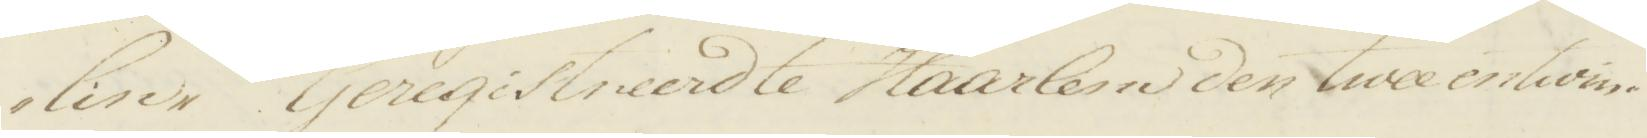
„ lin„ "Geregistreerd te Haarlem den twee en twin„
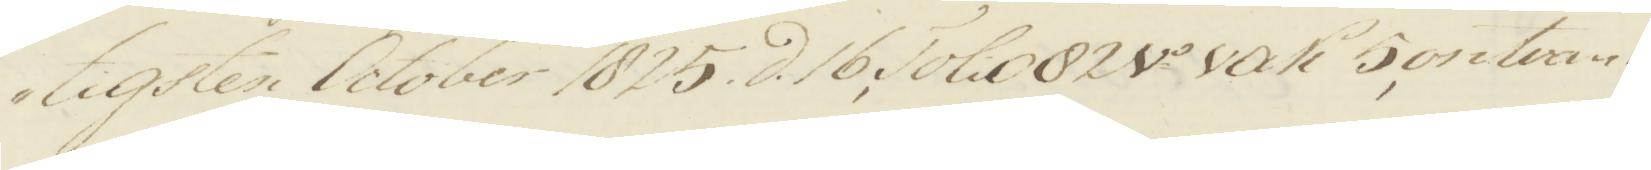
„ tigsten October 1825. d. 16 Folio 82 v=o vak 5, ontvan„
